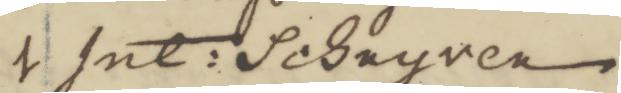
1 Jnl: schryver
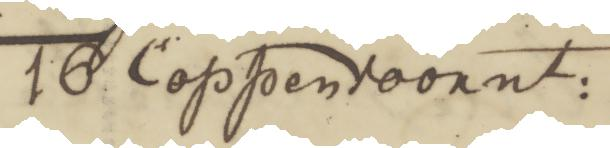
16. Coppen voornt:
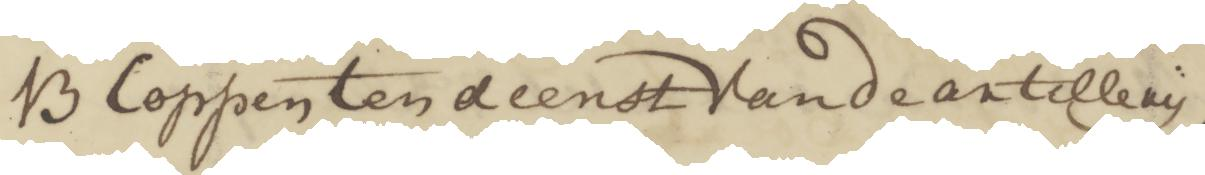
13 Coppen ten dienst van de artillerij
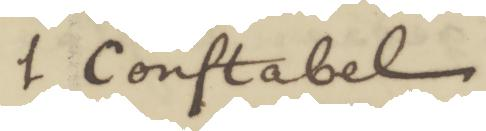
1 constabel
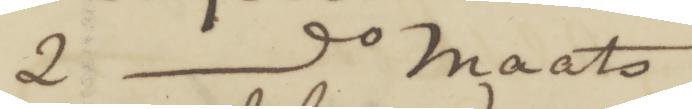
2 do Maats
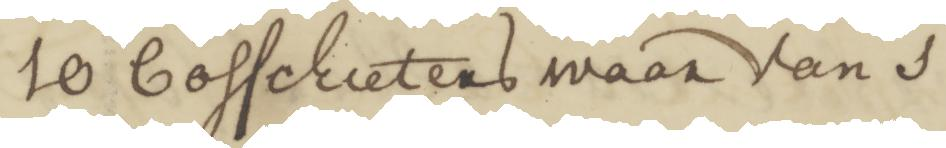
10 bosschieters waar van 3
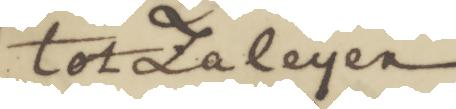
tot zaleyer
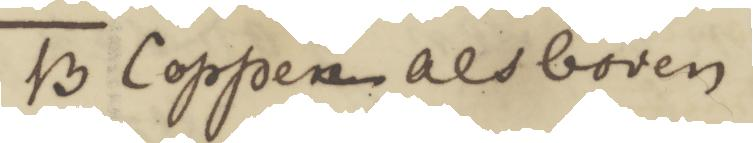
13 Coppen als boven
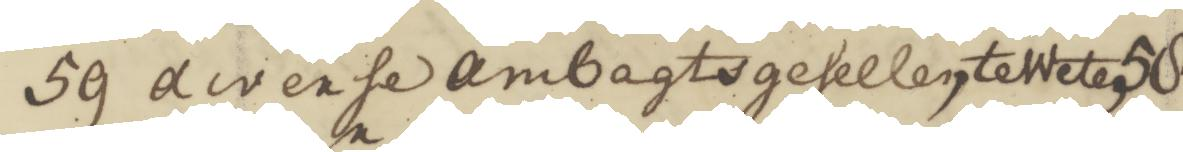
59 diverse ambagtsgesellen te weten 58
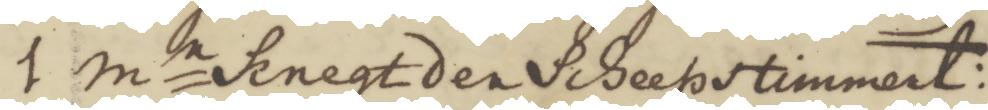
1 m=r kregt der scheepstimmerl:
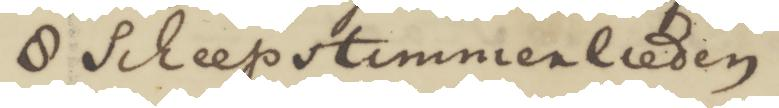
8 scheepstimmerlieden
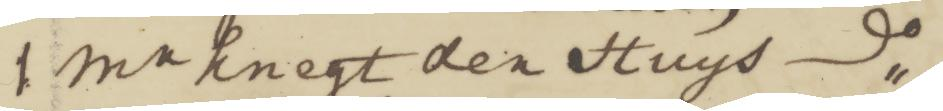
1. mr kregt der Huys _„o
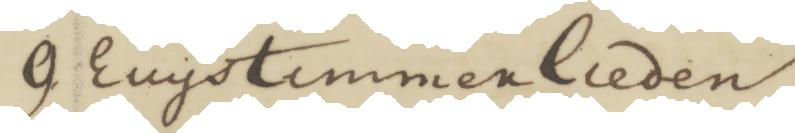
9. huijstimmerlieden
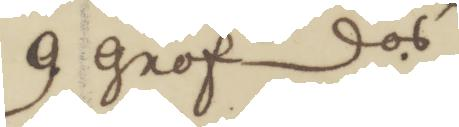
9 grof d.os
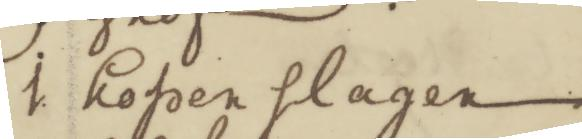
1. koper slager
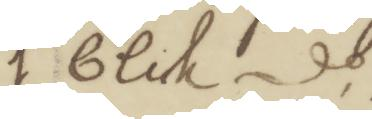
1 blik d,o
